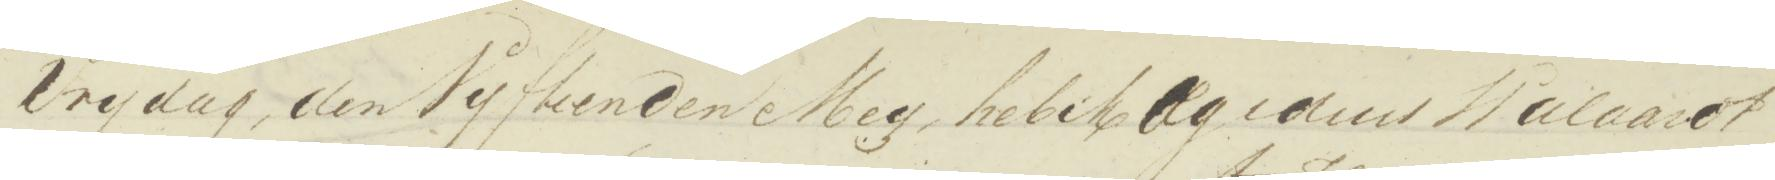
Vrydag, den Vyftienden Mey, heb ik AEgidius Walaardt
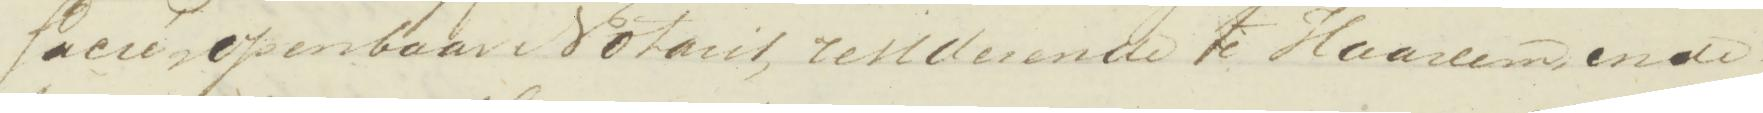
Sacré, openbaar Notaris residerende te Haarlem, in de
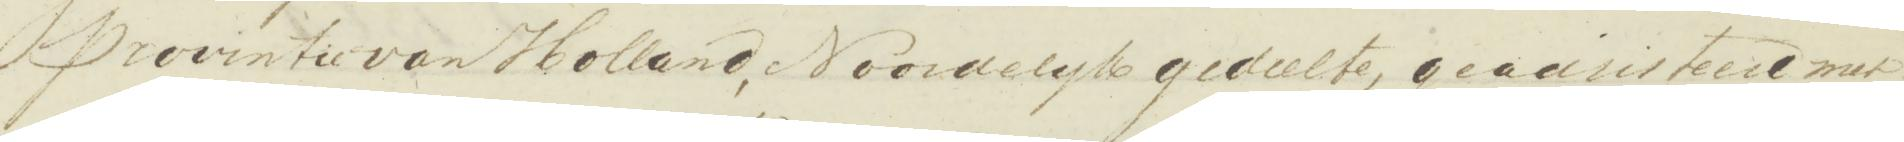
Provintie van Holland, Noordelyk gedeelte, geadsisteerd met
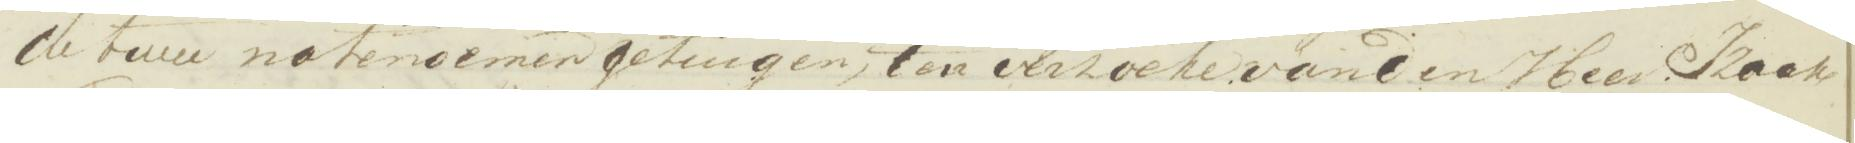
de twee na te noemen getuigen, ten verzoeke van den Heer Izaak
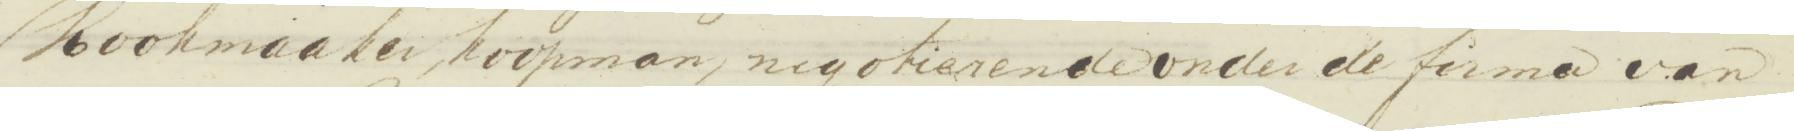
Rookmaaker, koopman, negotierende onder de firma van
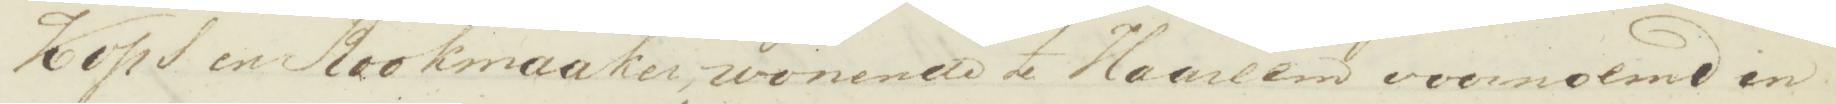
Kops en Rookmaaker, wonende te Haarlem voornoemd en
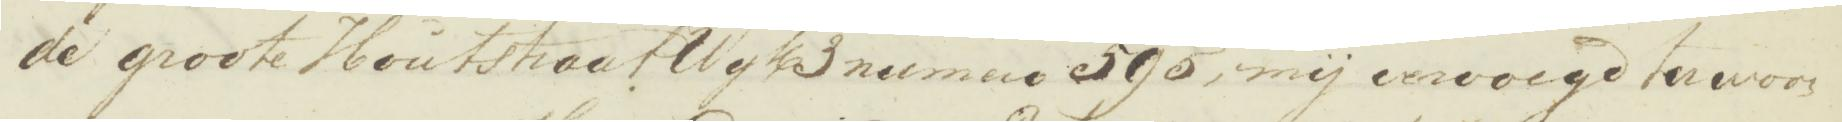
de groote Houtstraat Wyk 3 numero 595, mij vervoegd ter woon
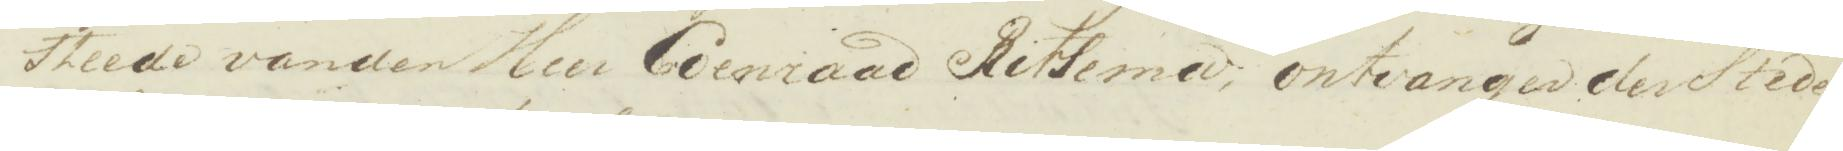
steede van den Heer Coenraad Ritsema; ontvanger der stede
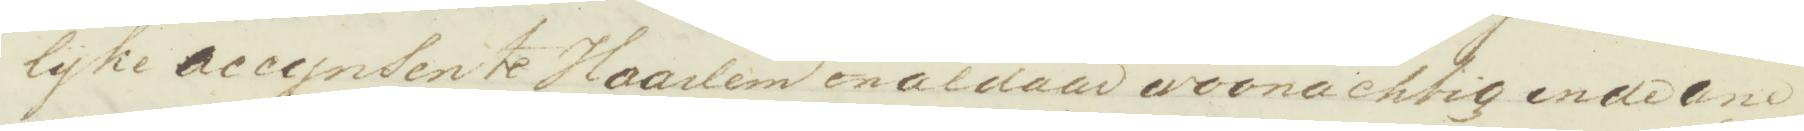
lijke accynsen te Haarlem en aldaar woonachtig in de Ane
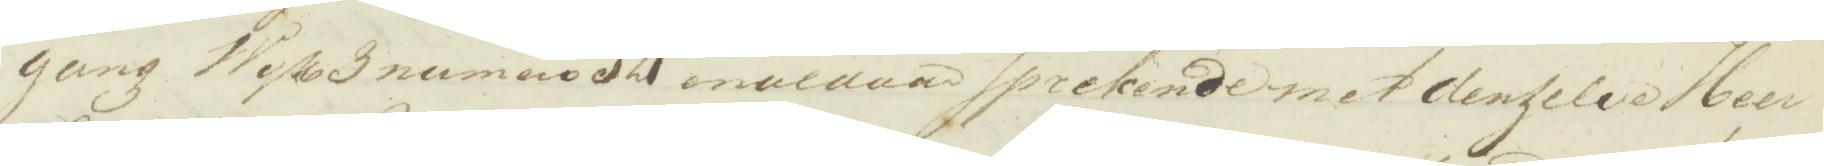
gang Wyk 3 numero 54 en aldaar sprekende met denzelve Heer
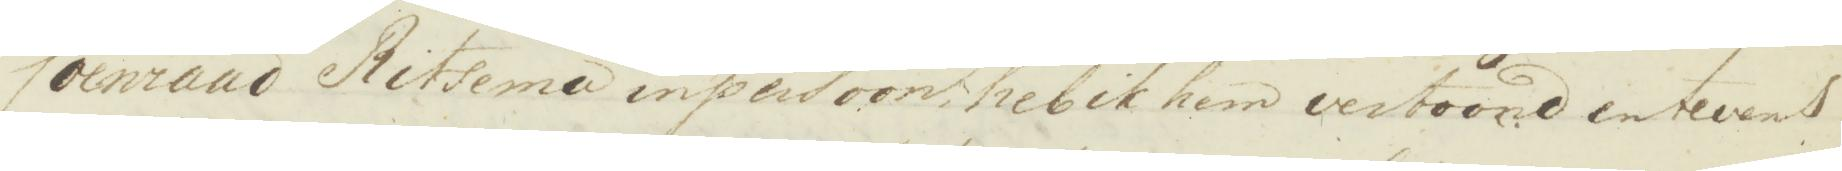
Coenraad Ritsema in persoon, heb ik hem vertoond en tevens
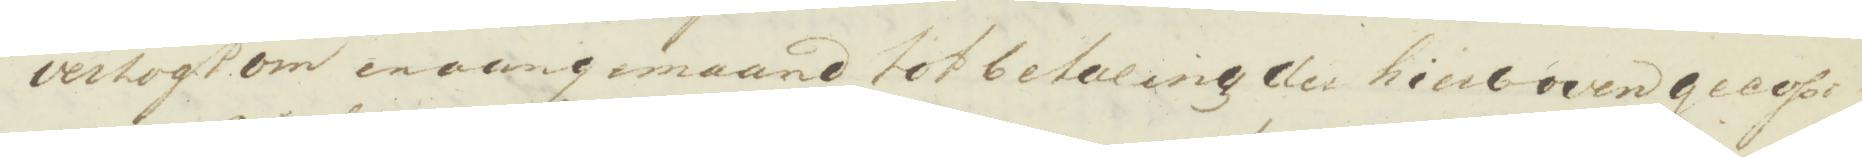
versogt om onaangemaand tot betaling der hierboven gecopi
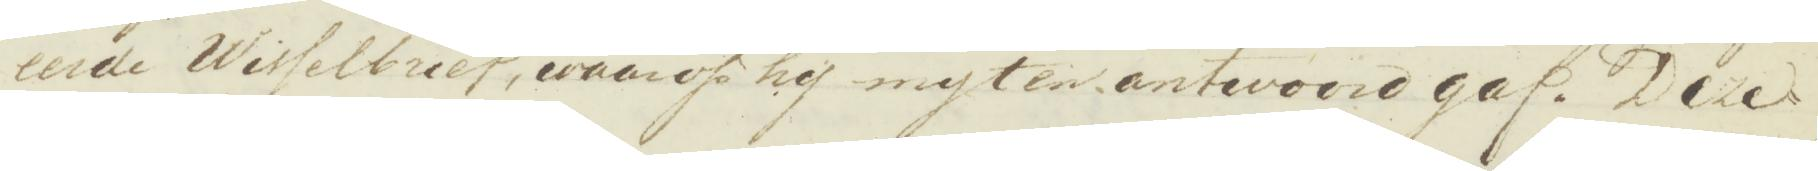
eerde Wisselbrief, waarop hij my ten antwoord gaf. Deze
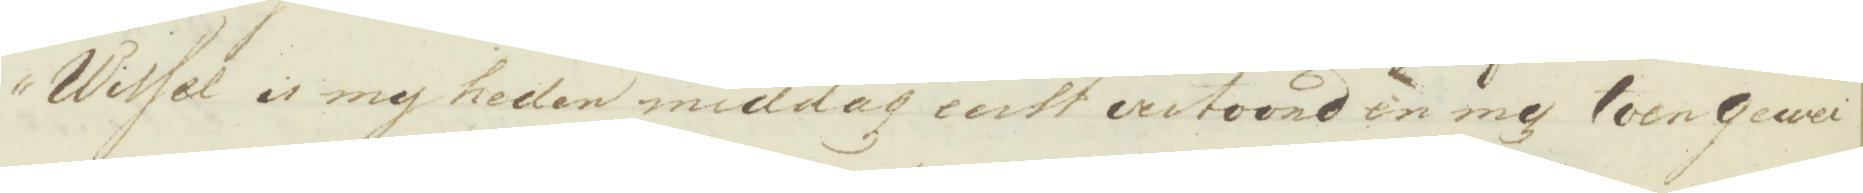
„ Wissel is my heden middag eerst vertoond en my toen gewei
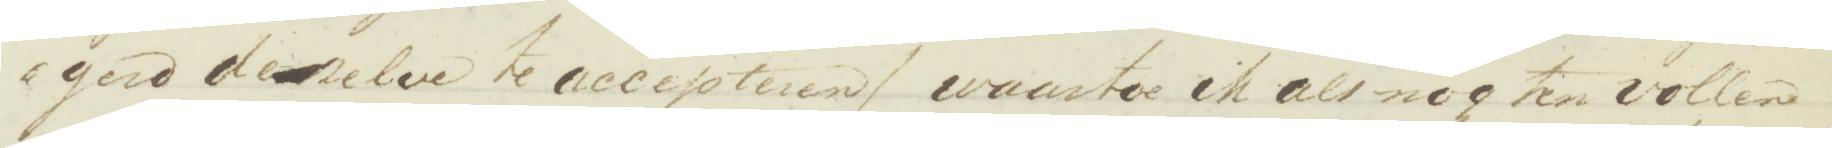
„gerd deselve te accepteren / waartoe ik als nog ten vollen
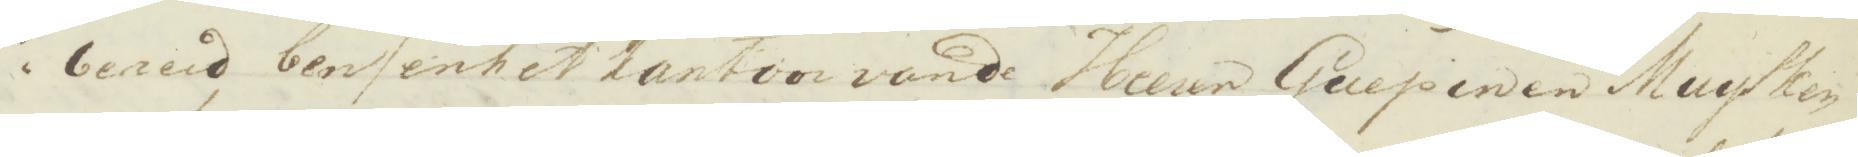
„ bereid ben en het kantoor vande Heeren Guepin en Muysken
